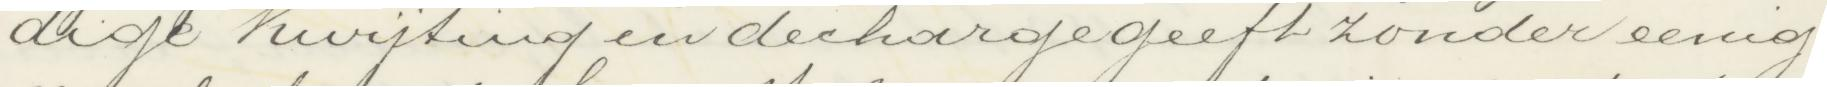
dige kwijting en decharge geeft zonder eenig
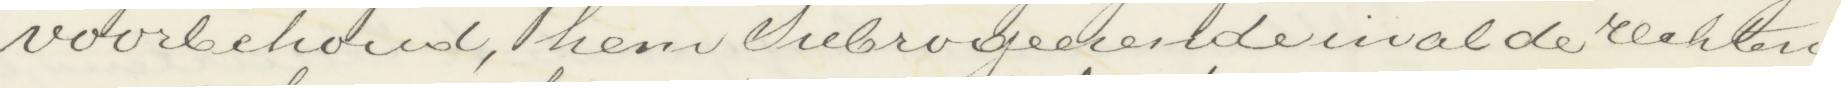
voorbehoud, hem subrogeerende in al de rechten
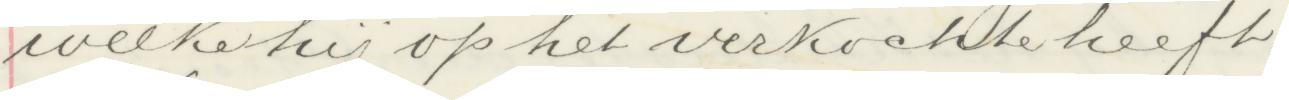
welke hij op het verkochte heeft.
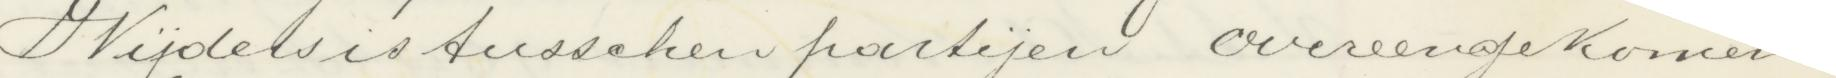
Wijders is tusschen partijen overeengekomen
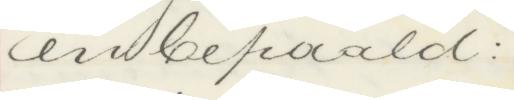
en bepaald:
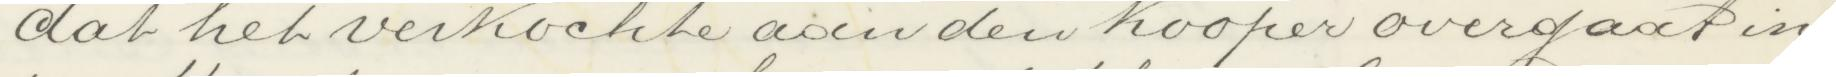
dat het verkochte aan den kooper overgaat in
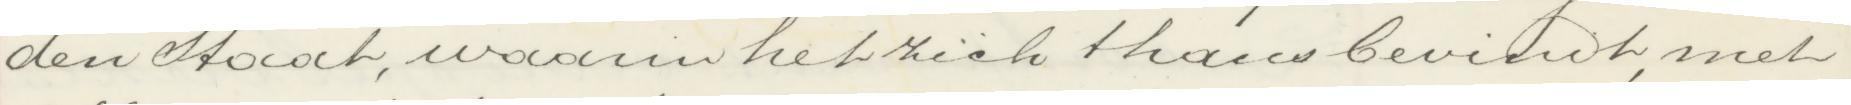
den staat, waarin het zich thans bevindt, met
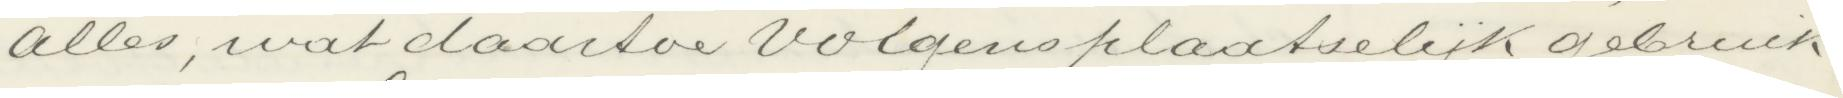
alles, wat daartoe volgens plaatselijk gebruik
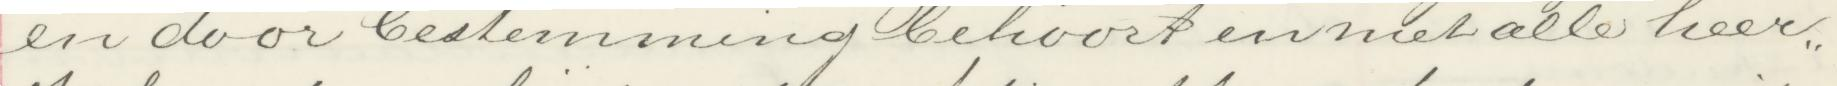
en door bestemming behoort en met alle heer„
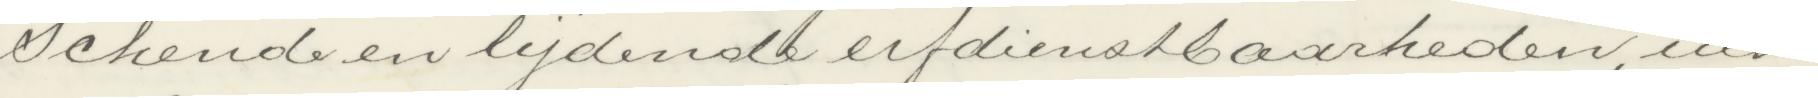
schende en lijdende erfdienstbaarheden, uit-
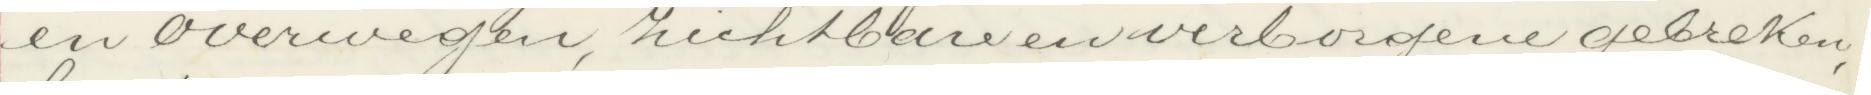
en overwegen, zichtbare en verborgene gebreken,
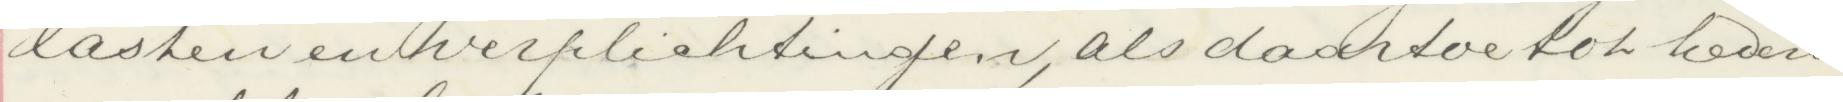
lasten en verplichtingen, als daartoe tot heden
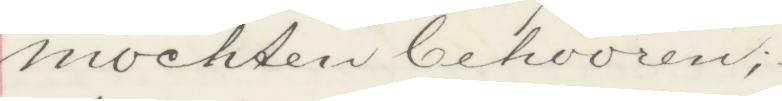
mochten behooren;
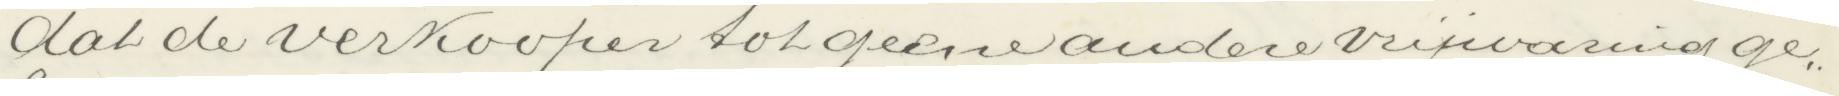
dat de verkooper tot geene andere vrijwaring ge„
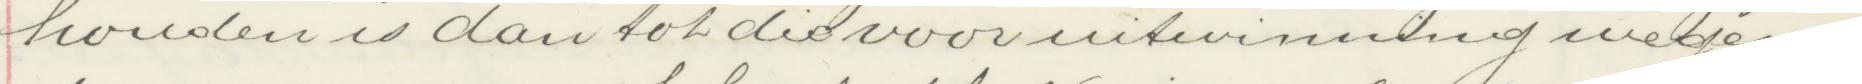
houden is dan tot die voor uitwinning wegens
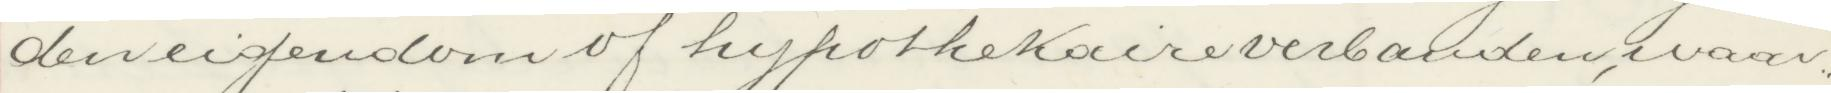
den eigendom of hypothekaire verbanden, waar
